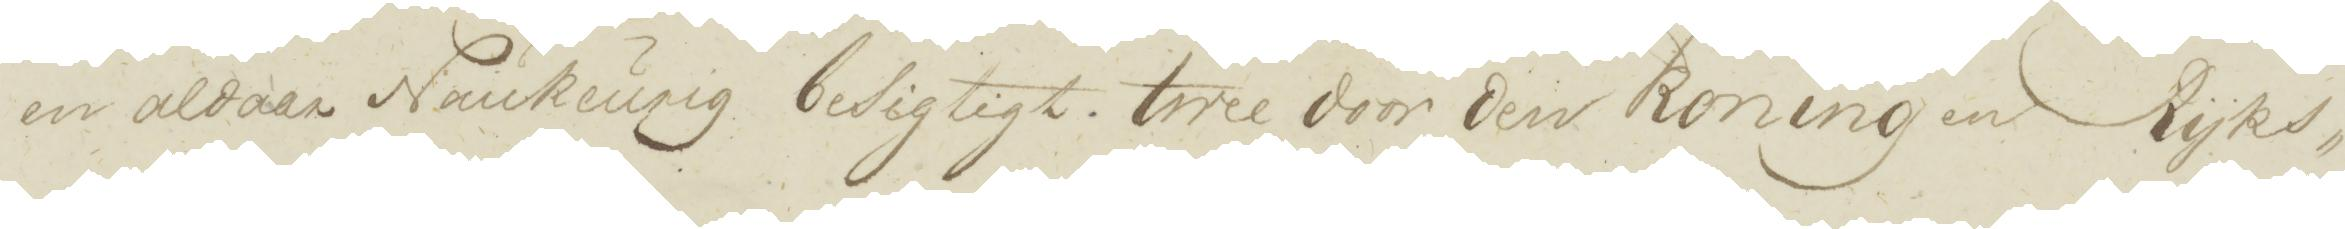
en aldaar Naukeurig besigtigt. twee door den Koning en Rijks„
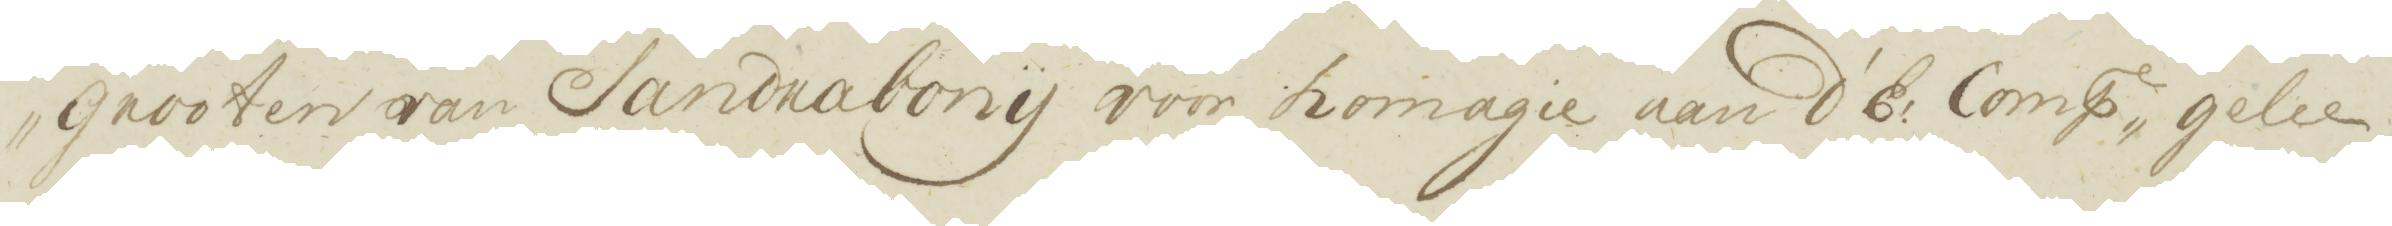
„grooten van Sandrabonij voor homagie aan d’E: Comp„s gelee„
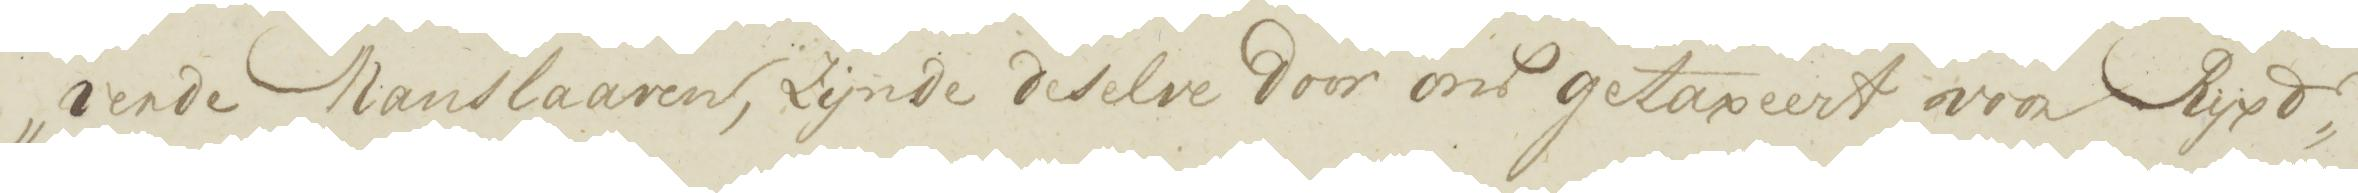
„verde Manslaaven, zijnde deselve door ons getaxeert voor Rijxd„s
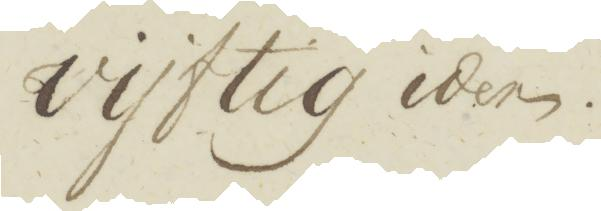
vijftig ider
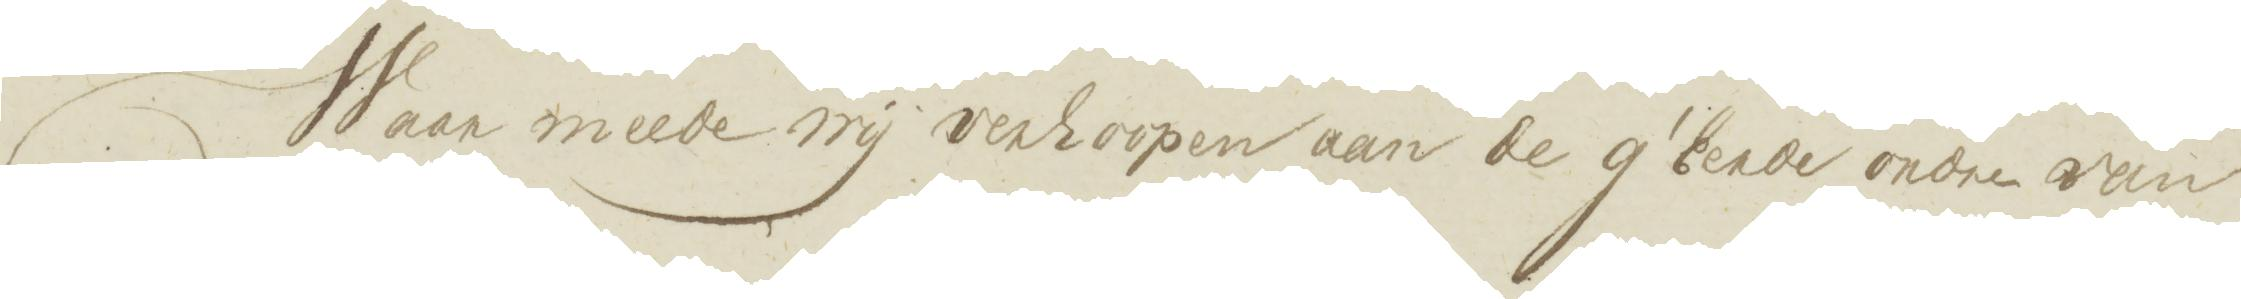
Waar meede wij verhoopen aan de g’Eerde ordre van
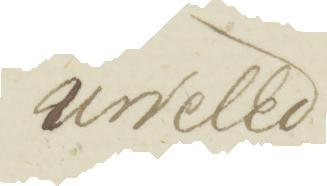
uwelEd
